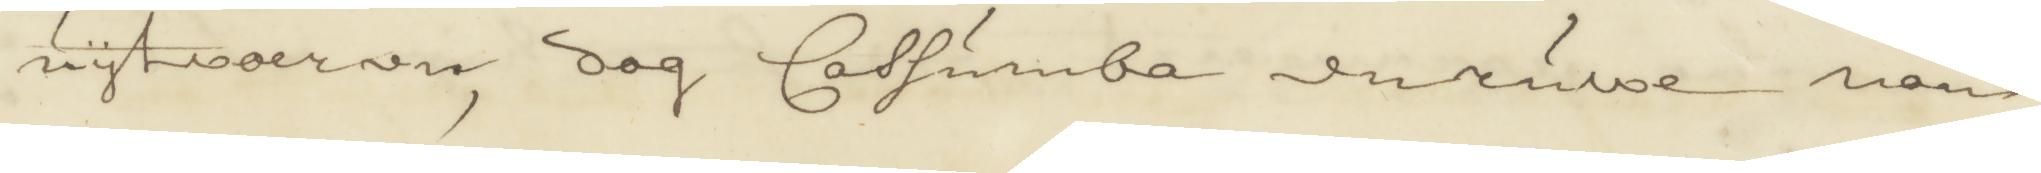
uijtvoeren, dog Cassumba en ruwe nan
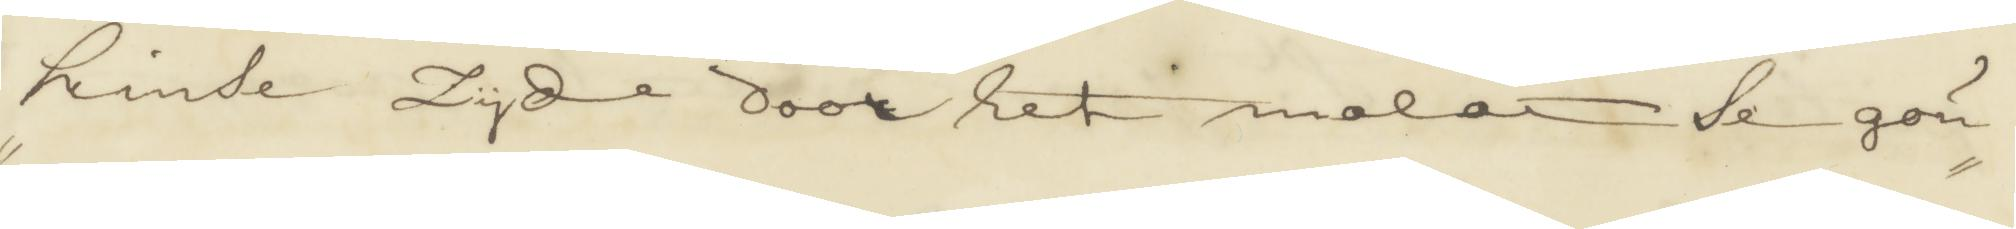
„kinse zijde door het malacse gou„
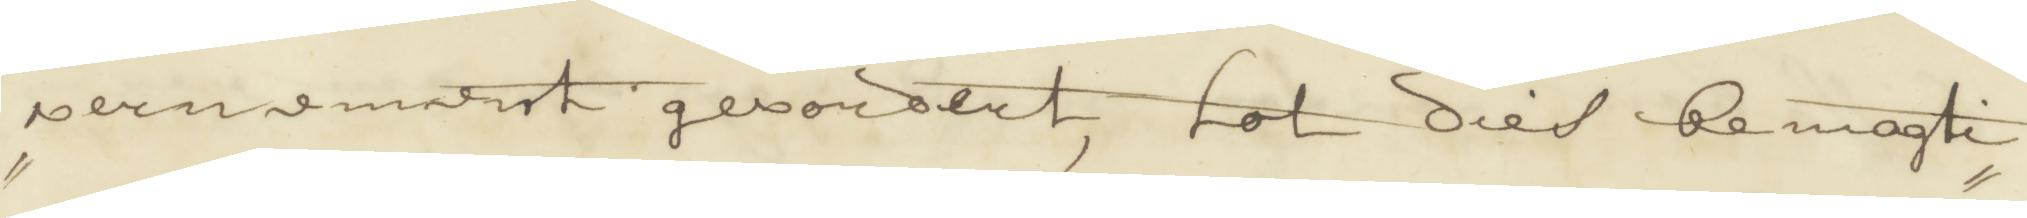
„vernement gevordert, tot dies bemagti„
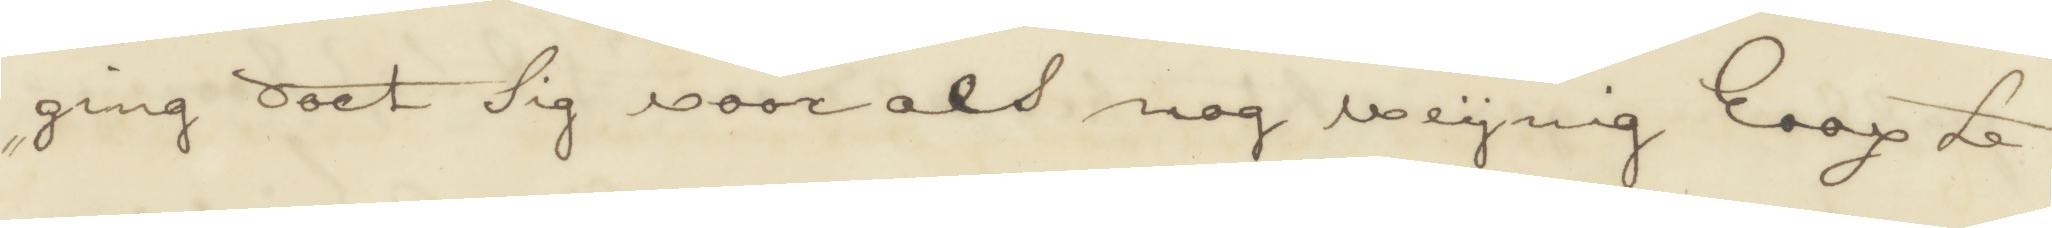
„ging doet sig voor als nog weijnig hoop te
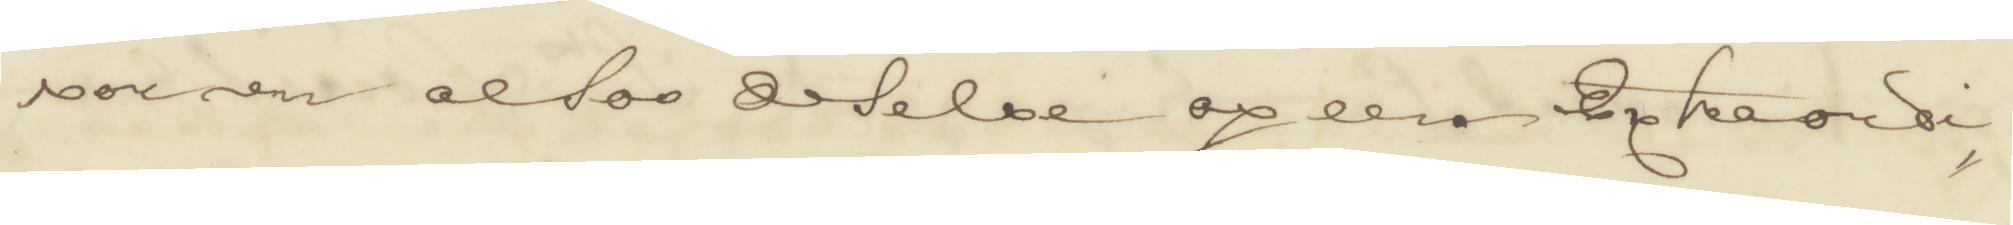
voren alsoo deselve op een Extraordi„
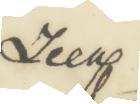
zeer
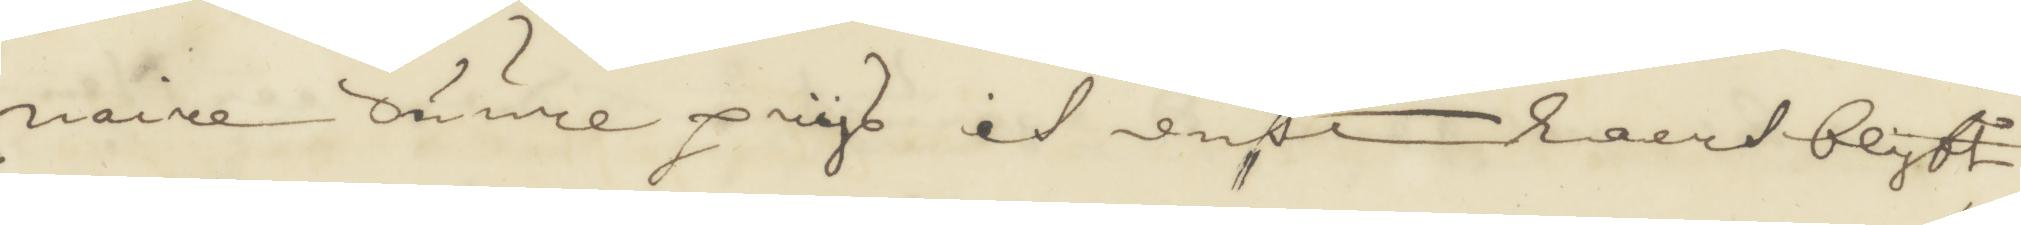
„naire duure prijs is en „ schaers blijft,
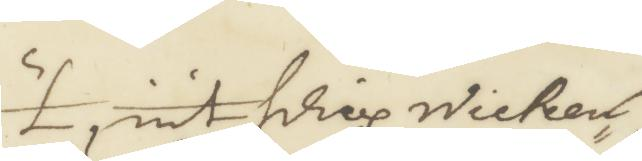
't, in't schip wicken„
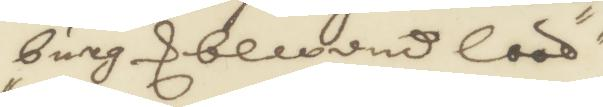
„burg verblevene lood
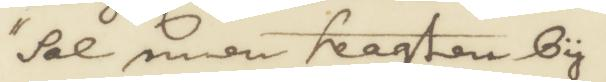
sal men tragten bij
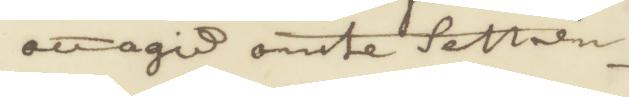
occagie omte setten
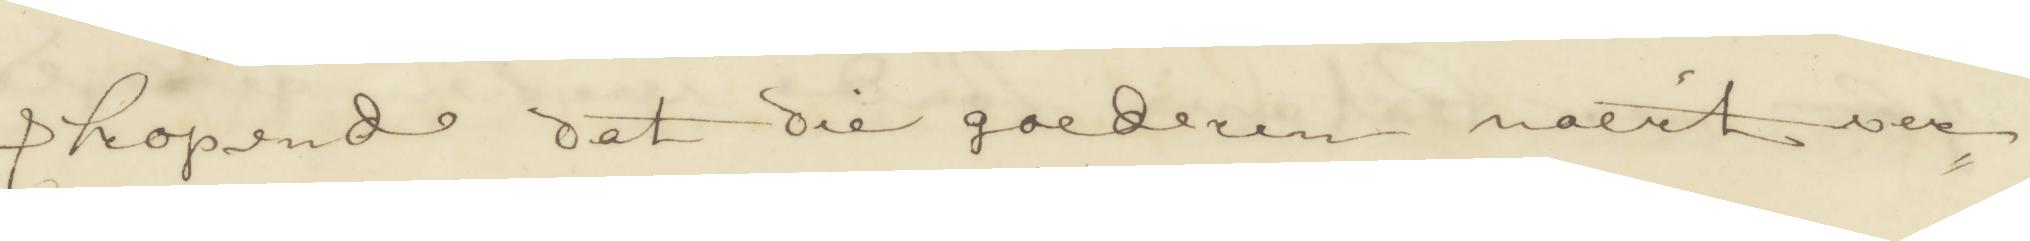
verkopende dat die goederen naer't ver„
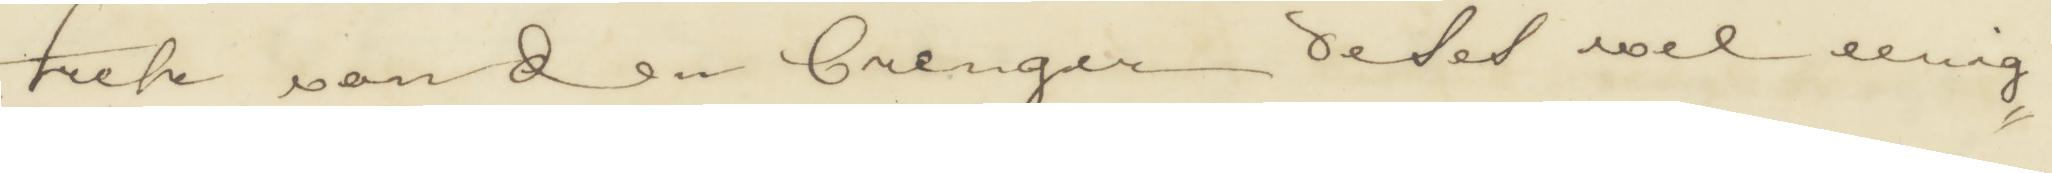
trek van den brenger deses wel eenig„
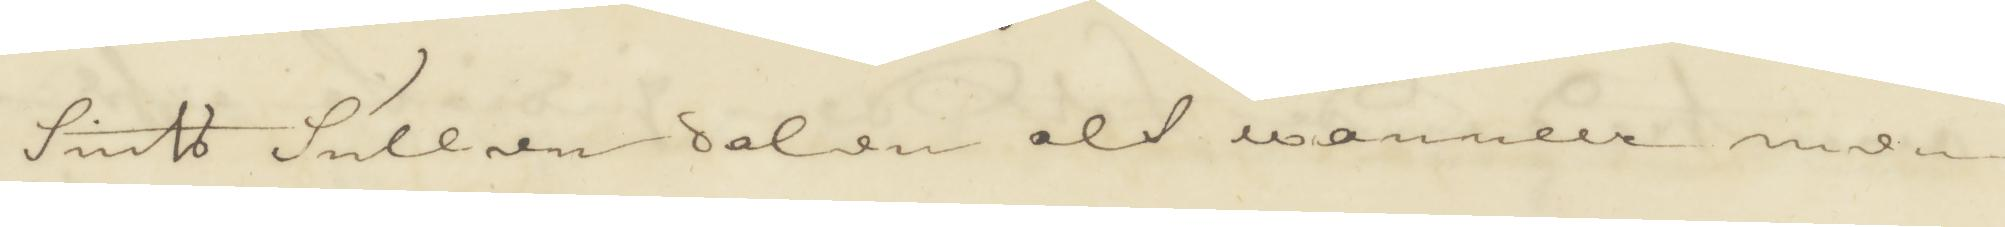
sints sullen dalen als wanneer men
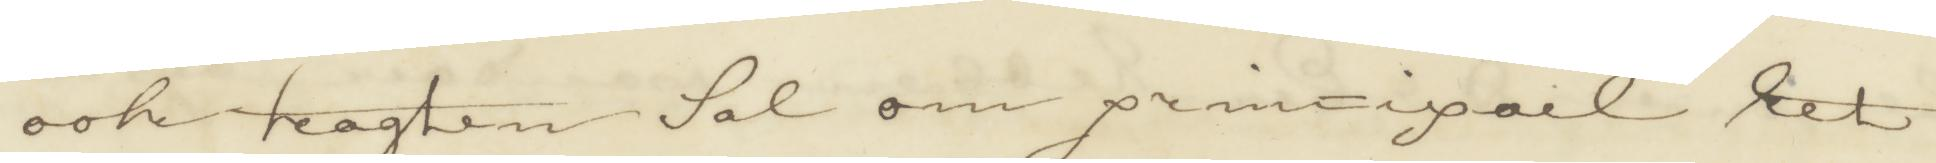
ook tragten sal om principael het
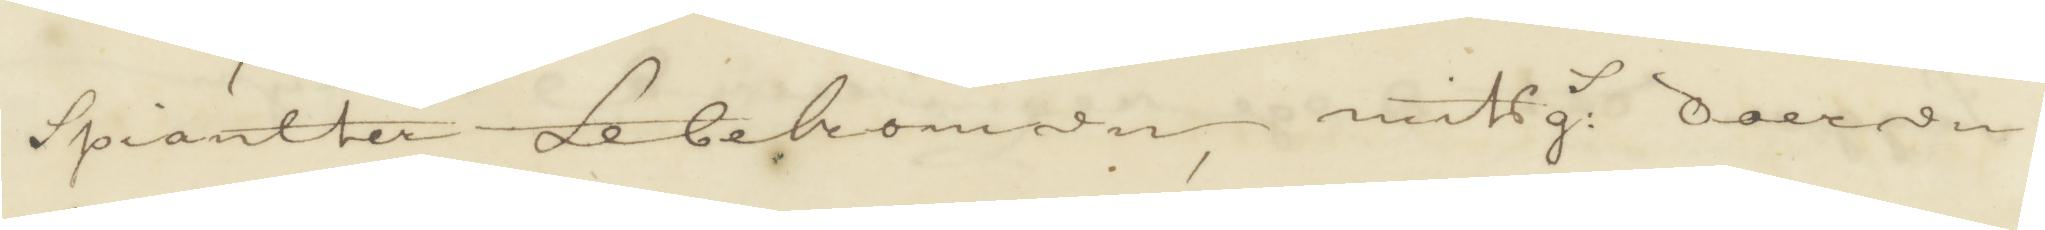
spiaulter te bekomen, mitsg:s daeren
